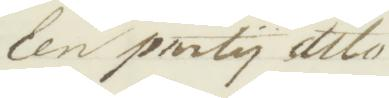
Een partij dito
